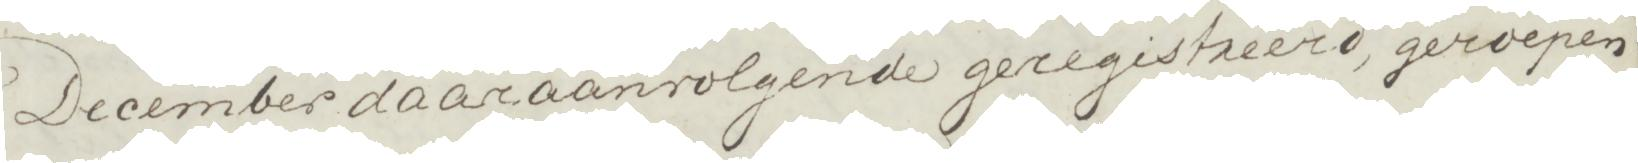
December daar aanvolgende geregistreerd, geroepen
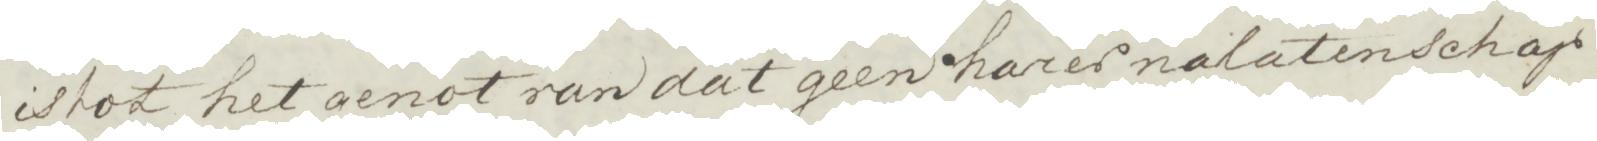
is tot het genot van dat geen harer nalatenschap
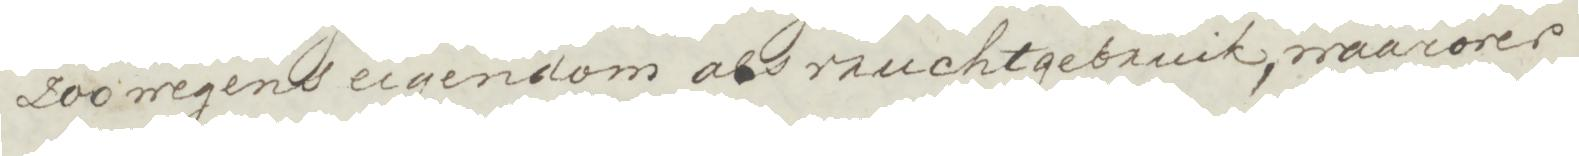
zoo wegens eigendom als vruchtgebruik, waarover
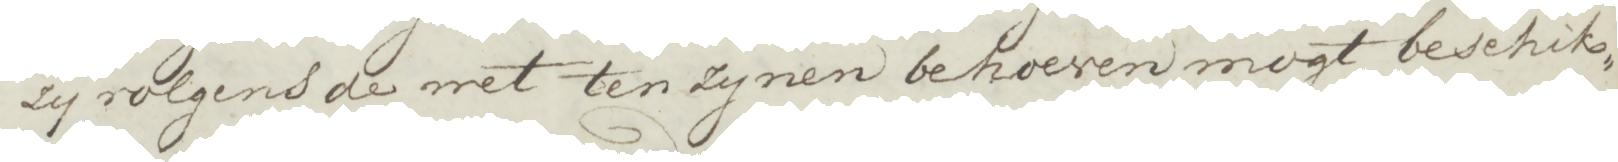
zy volgens de wet ten zynen behoeven mogt beschik„
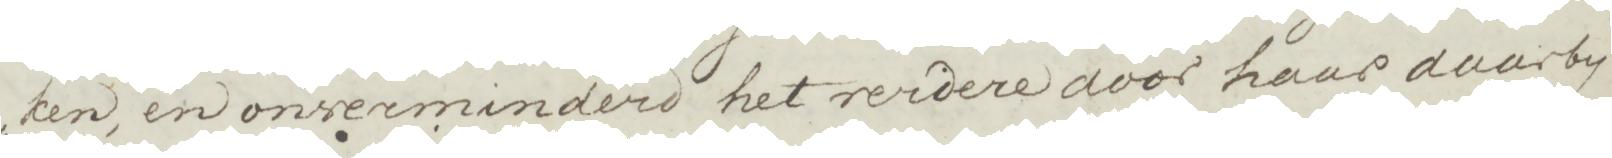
„ken, en onverminderd het verdere door haar daarby
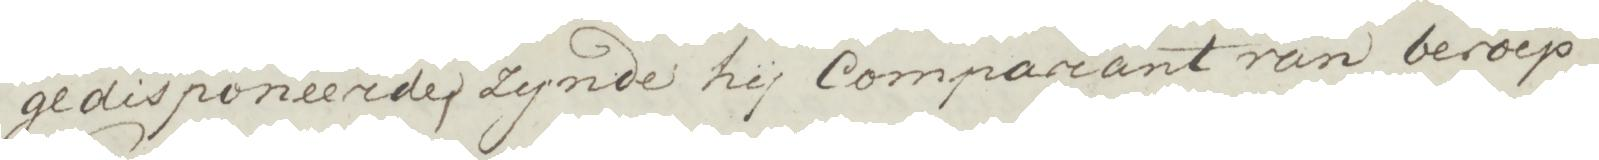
gedisponeerde, zynde hij Comparant van beroep
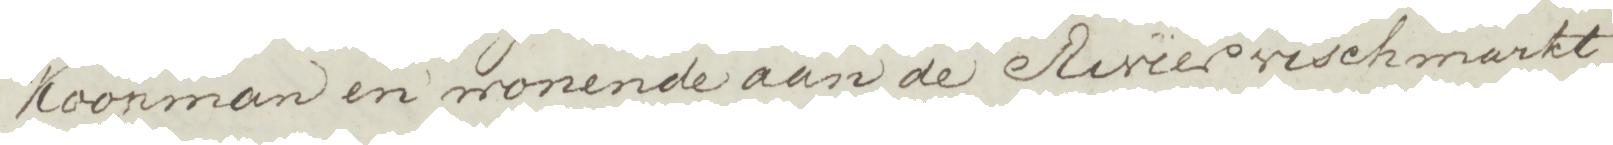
Koopman en wonende aan de Niwes vischmarkt
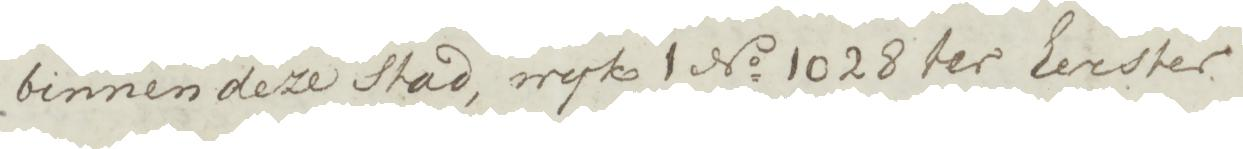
binnen deze stad, wyk 1 N=o 1028 ter Eerster
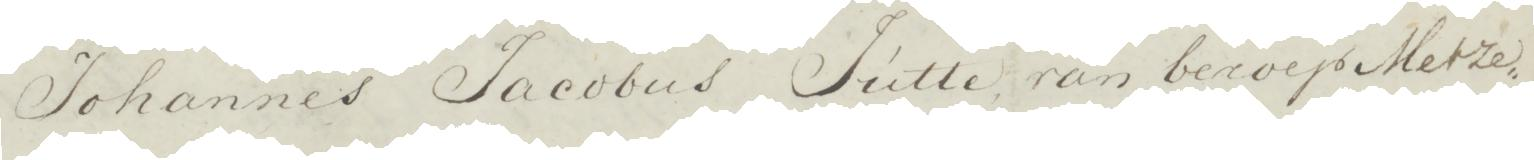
Iohannes Iacobus Iutte, van beroep Metze„
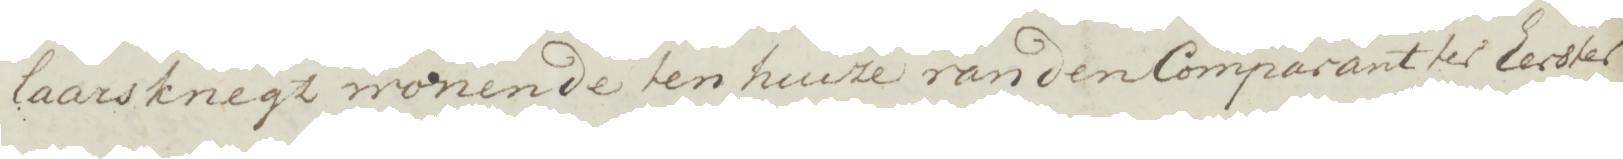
laars knegt wonende ten huize van den Comparant ter Eerster
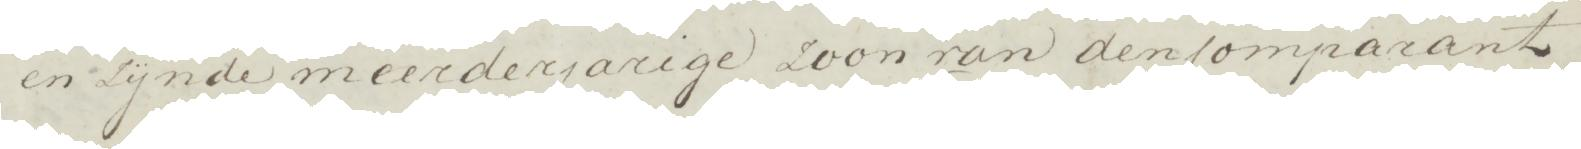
en zijnde meerderjarige zoon van den comparant
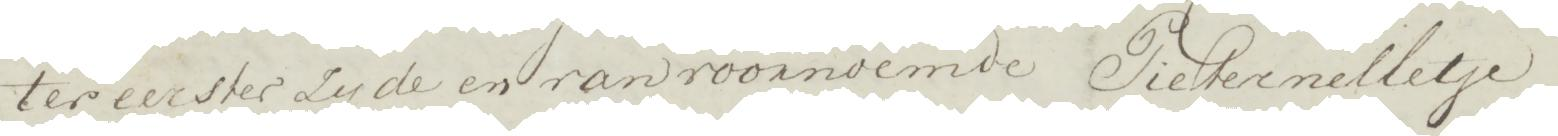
ter eerster zyde en van voornoemde Pieternelletje
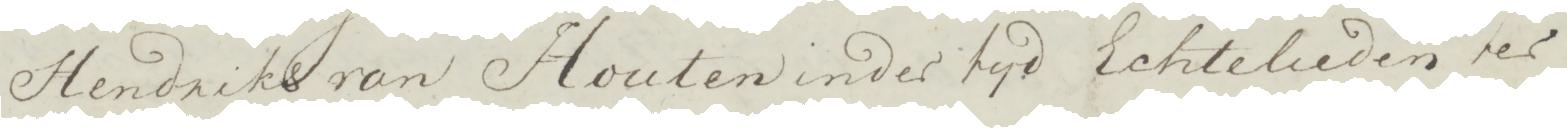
Hendriks van Houten inder tyd Echtelieden ter
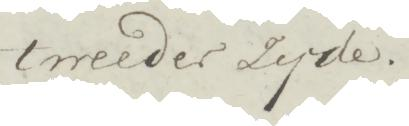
tweeder zyde.
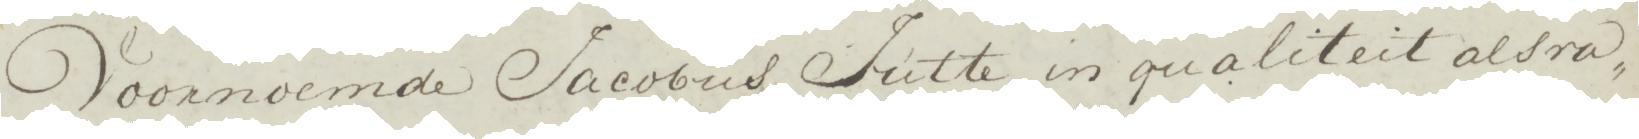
Voornoemde Iacobus Iutte in qualiteit als va„
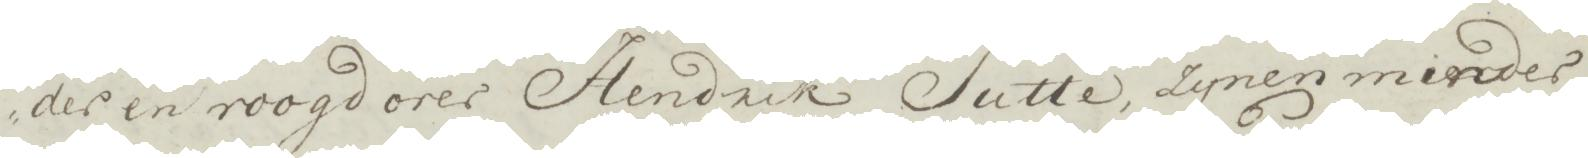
„der en voogd over Hendrik Iutte, zynen minder
